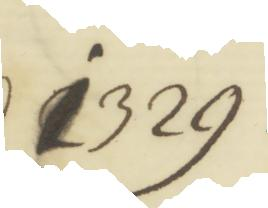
1329
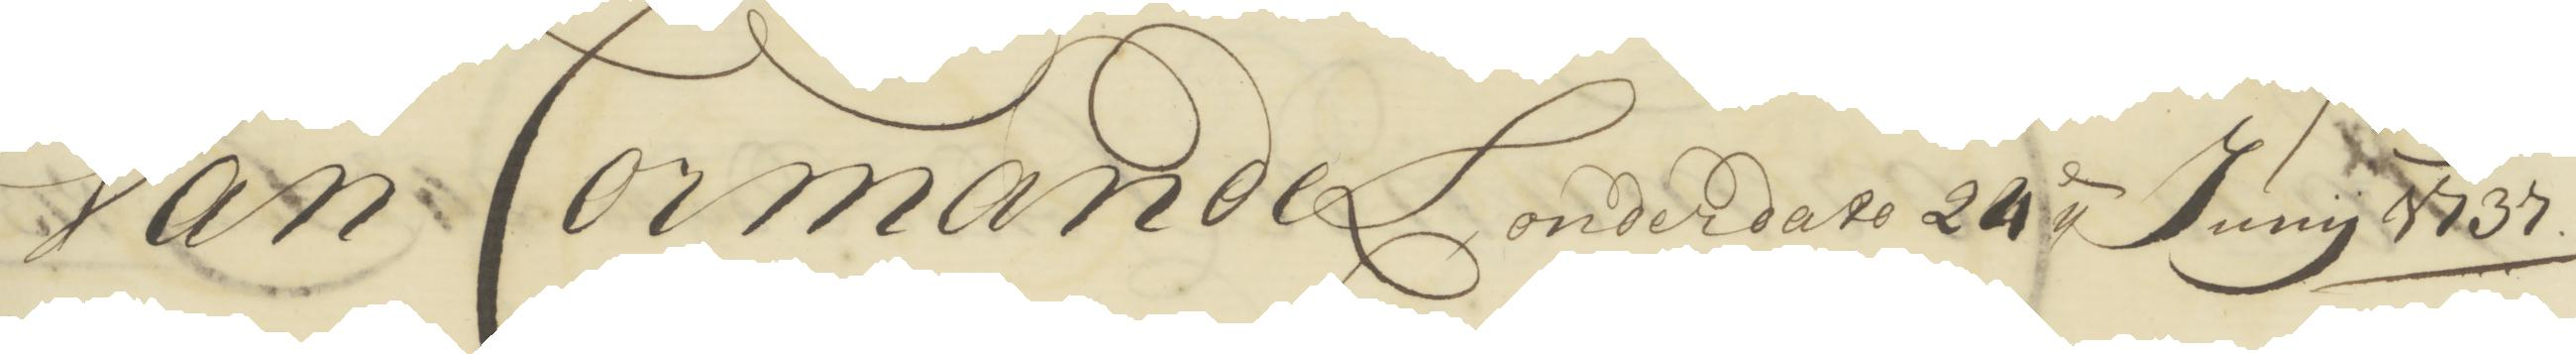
Van Cormandel onder dato 24„en Junij 1737
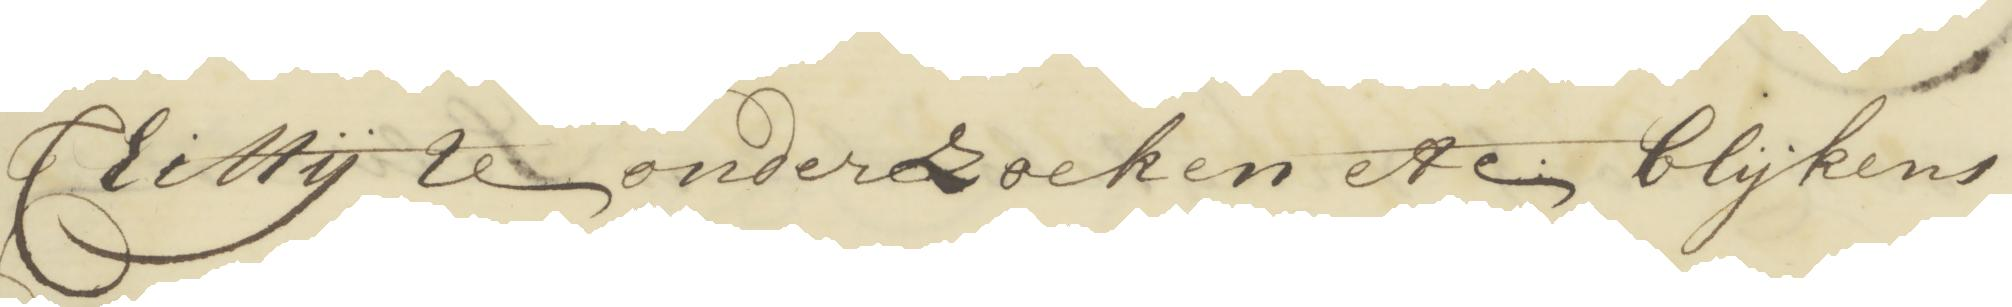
Chittij te onderzoeken etc: blijkens
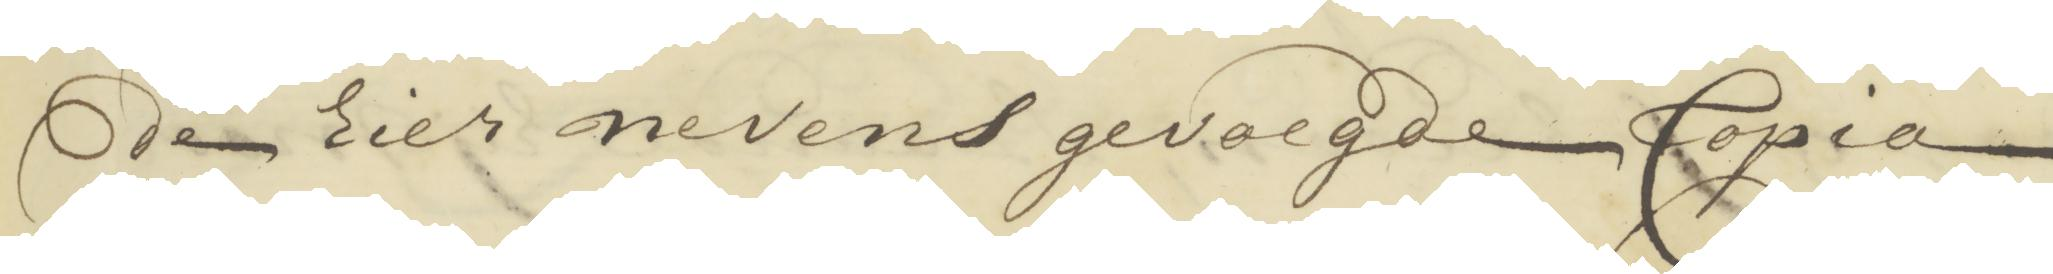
de hier nevens gevoegde Copia
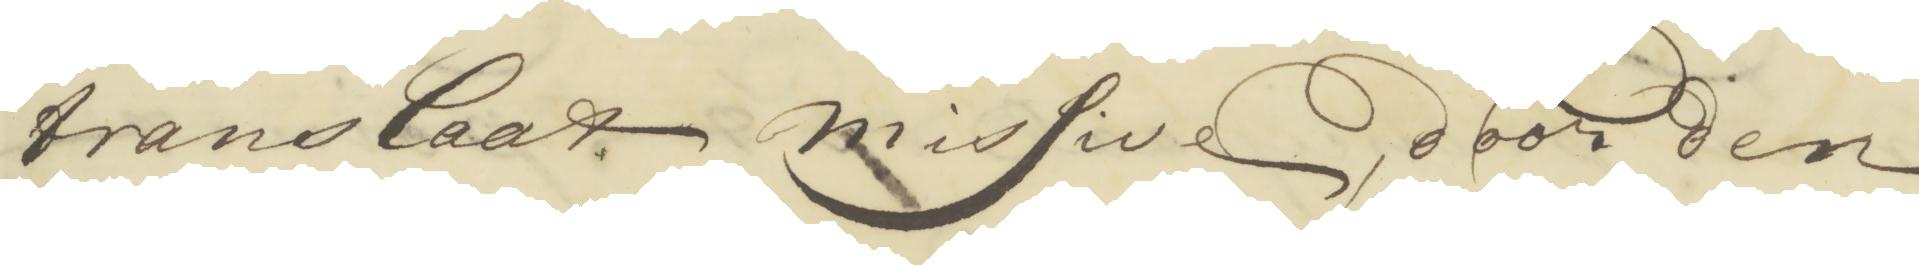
translaat missive, door den
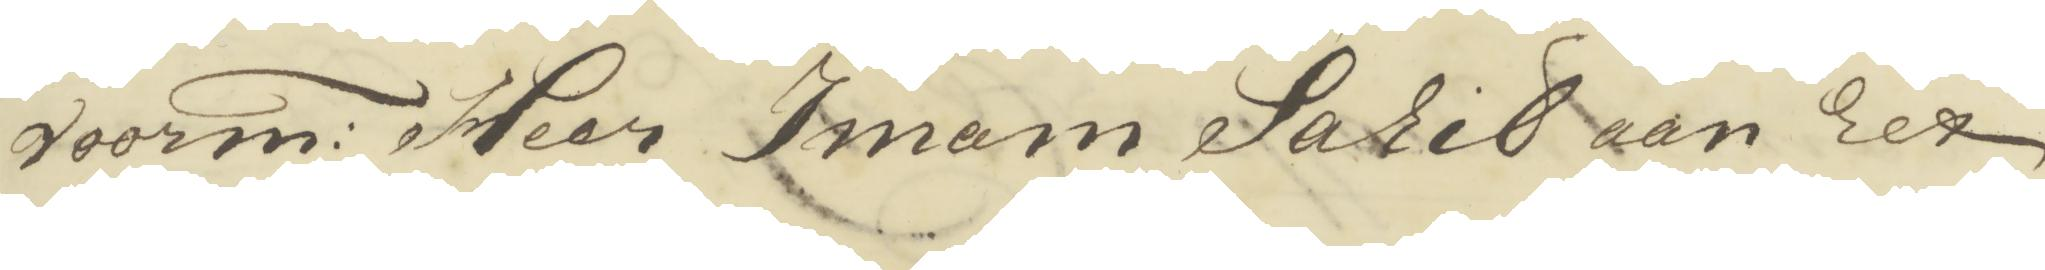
voorm: Heer Imam Sahib aan het
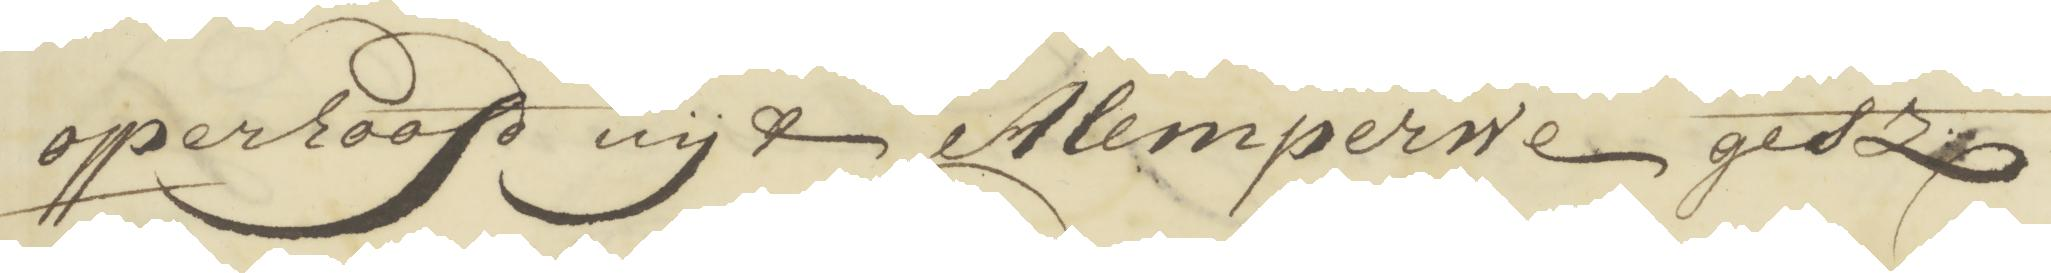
opperhoofd uijt Alemperwe gesz:
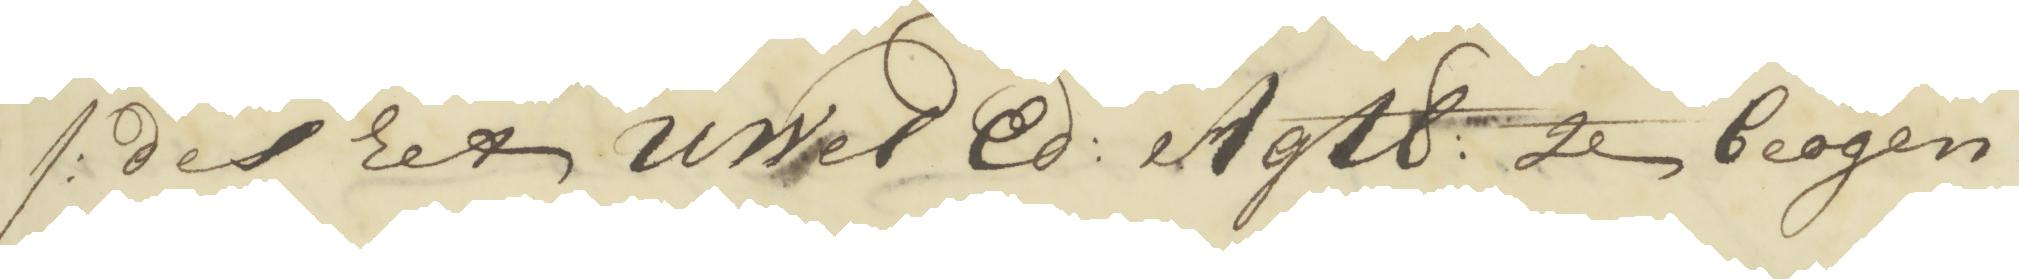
/:des het uwel Ed: Agtb: te beogen
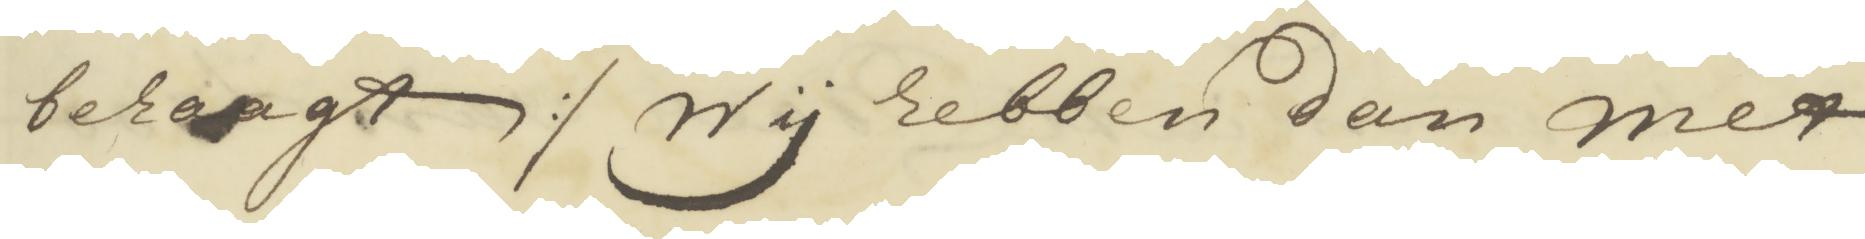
behaagt:/ wij hebben dan met
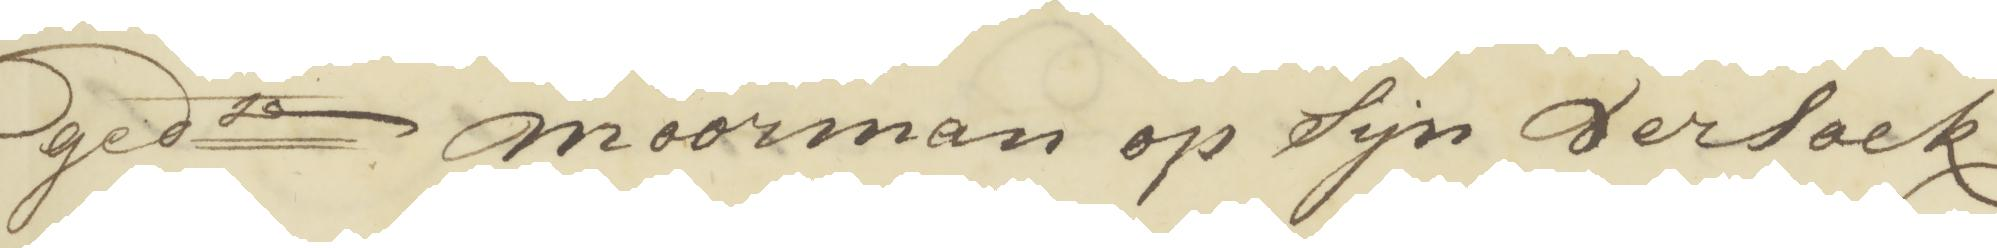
ged=te moorman op sijn versoek
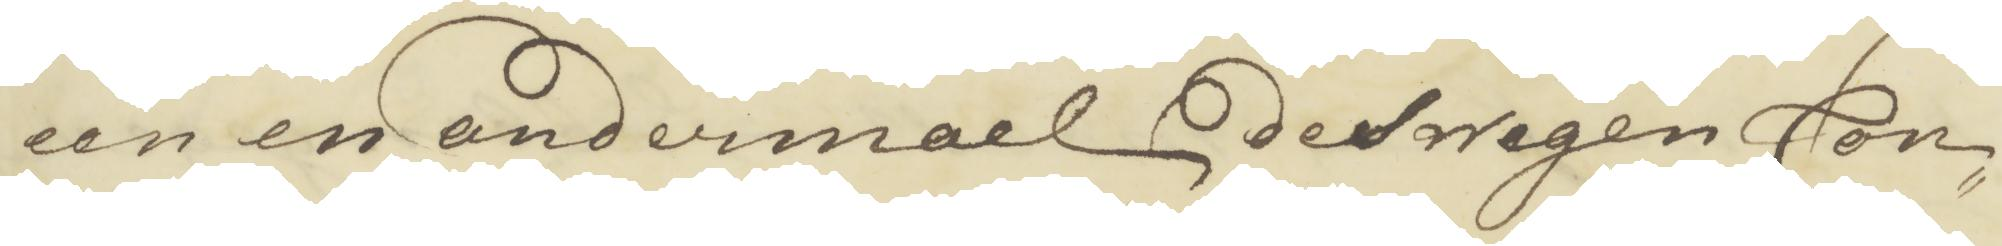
een en andermael deswegen Con„
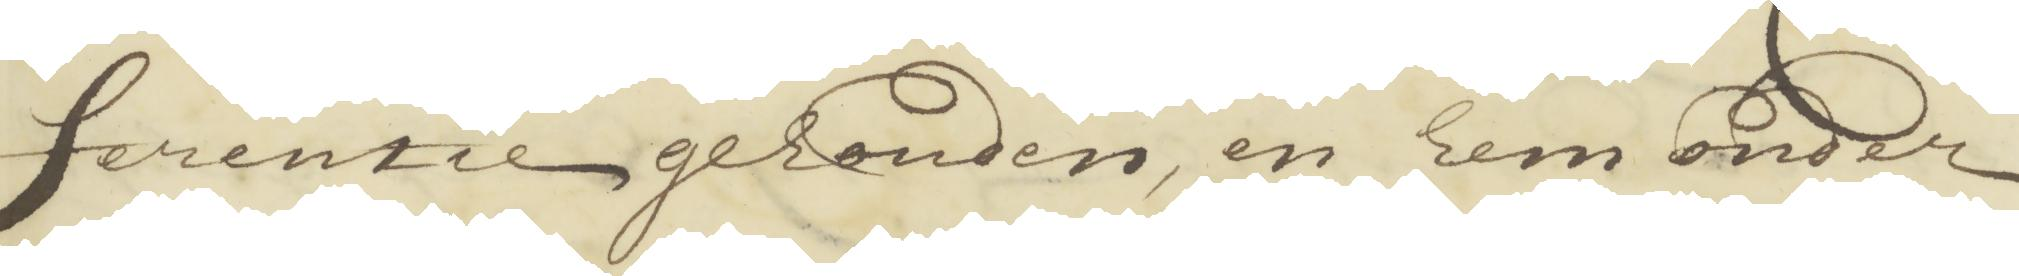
ferentie gehouden, en hem onder
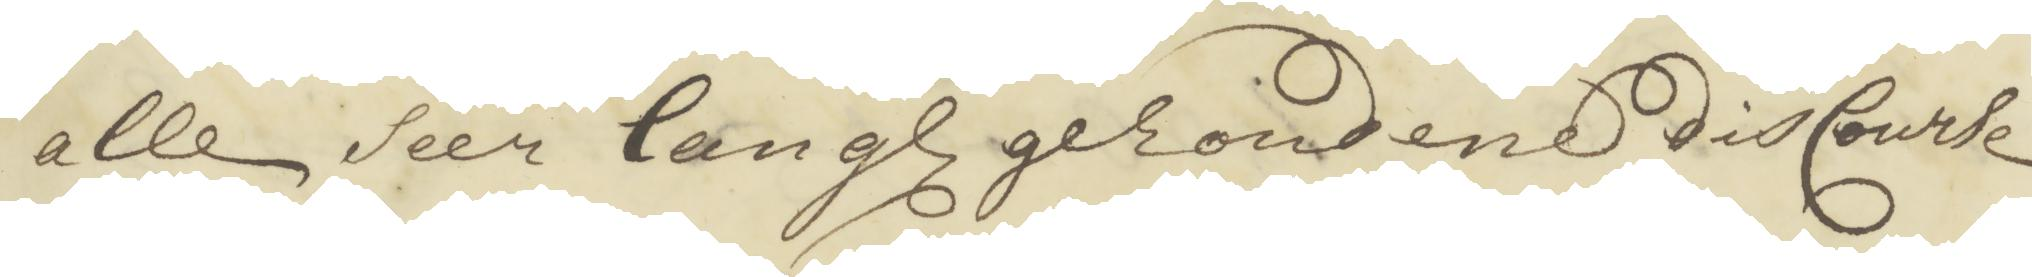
alle seer langh gehoudene discourse
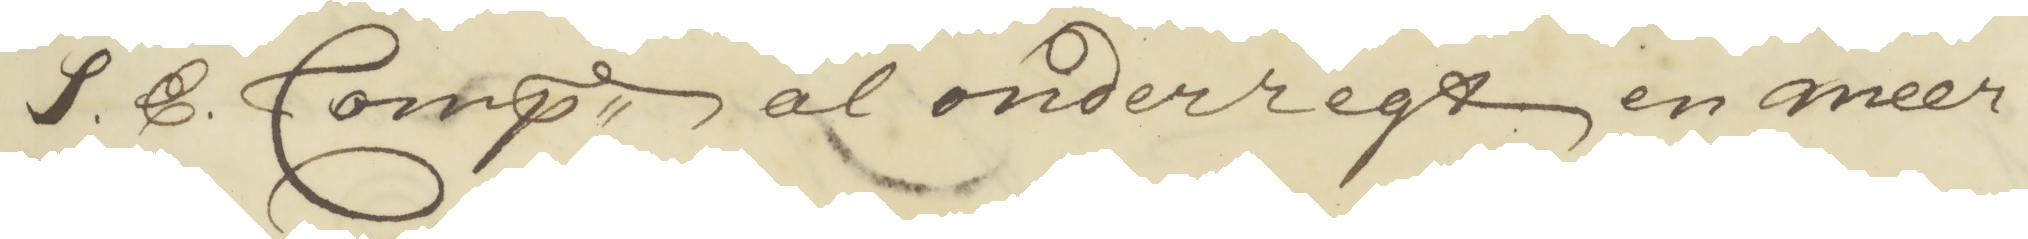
S. E. Comp„e al onderregt en meer
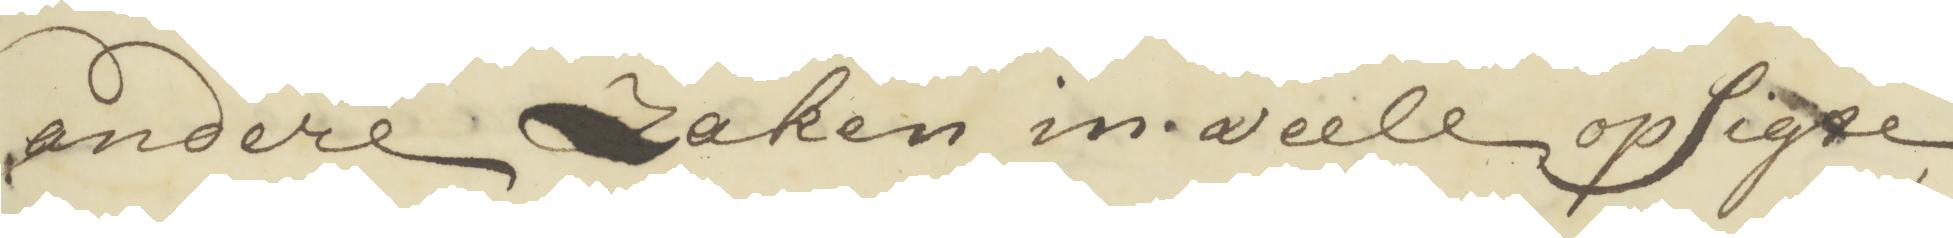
andere zaken in veele opsigte,
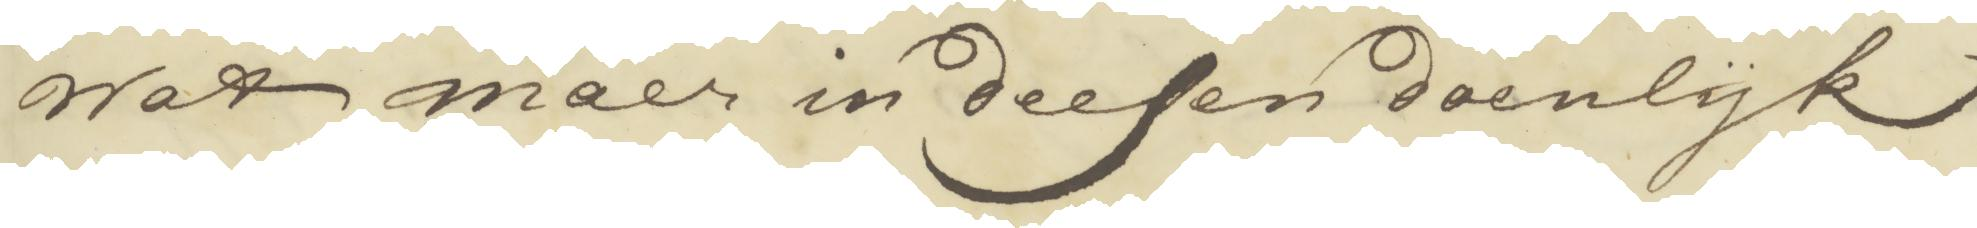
wat maer in deesen doenlijk
